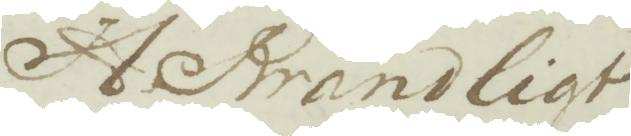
H Brandligt
